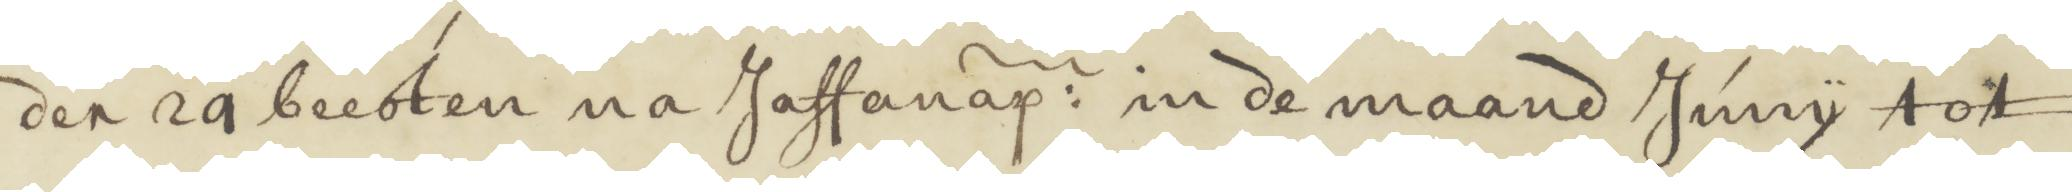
der 24 beesten na Jaffanap:m in de maand Junij tot
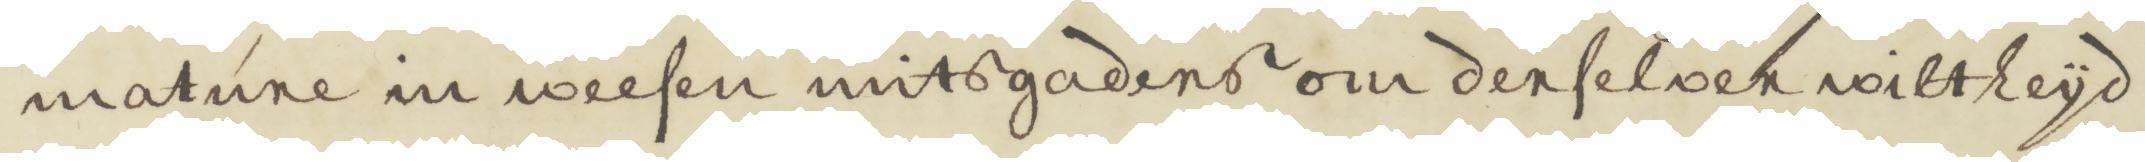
mature in weesen mitsgaders om derselver wiltheijd
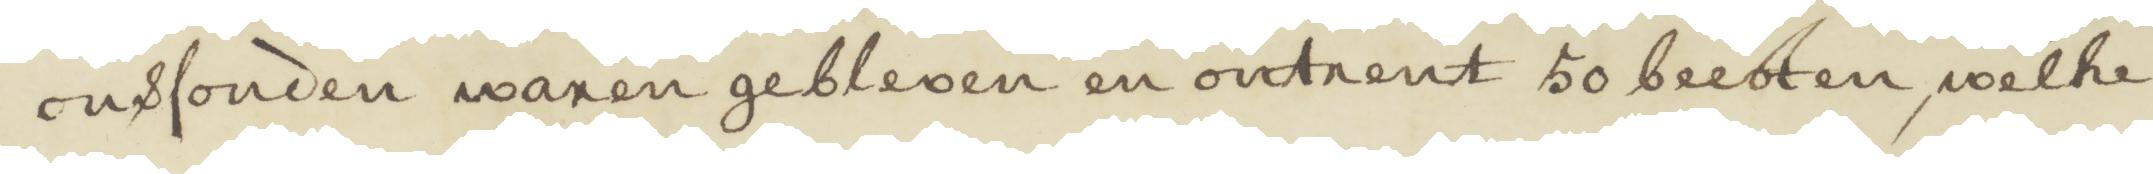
onversonden waren gebleven en ontrent 50 beesten, welke
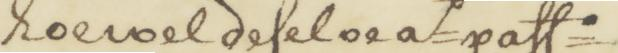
hoewel deselve a=o pass=o
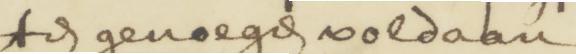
ten genoegen voldaan
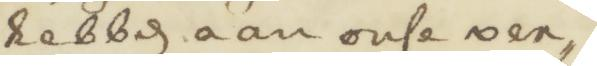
hebben aan onse ver„
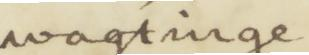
wagtinge
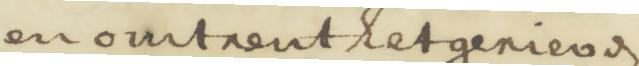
en omtrent het gerieven
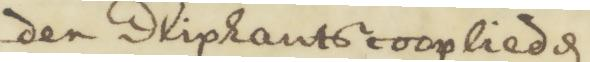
der Eliphants cooplieden
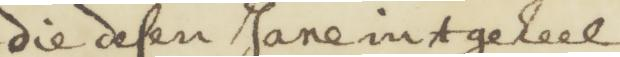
die desen Jare in t geheel
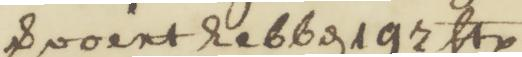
vervoert hebben 147 stx
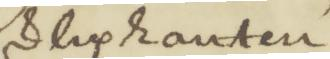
Eliphanten
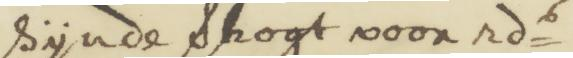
sijnde verkogt voor rd=s
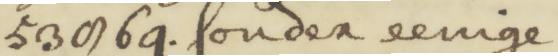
53864. sonder eenige
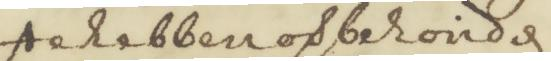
te hebben overbehouden
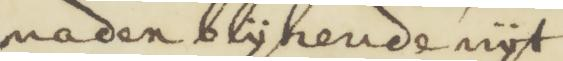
nader blijkende uijt
